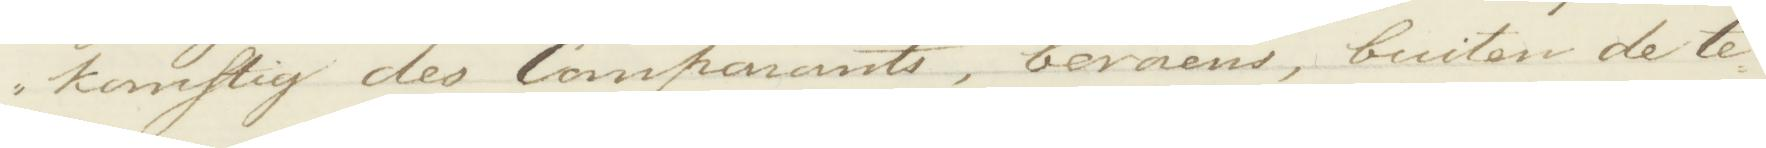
„komstig des Comparants, bevorens, buiten de te„
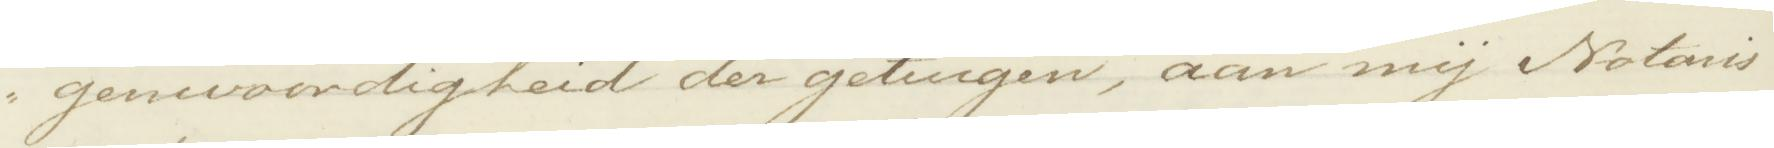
„genwoordigheid der getuigen, aan mij Notaris
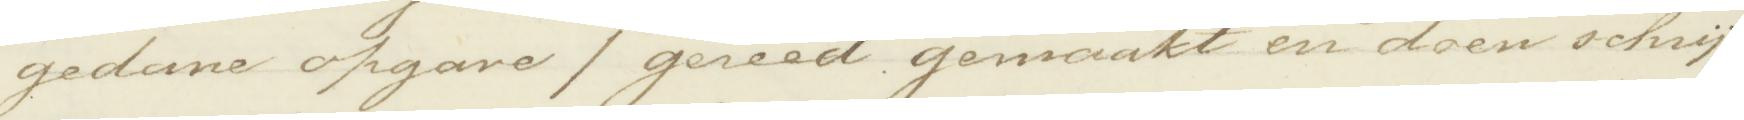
gedane opgave / gereed gemaakt en doen schrij
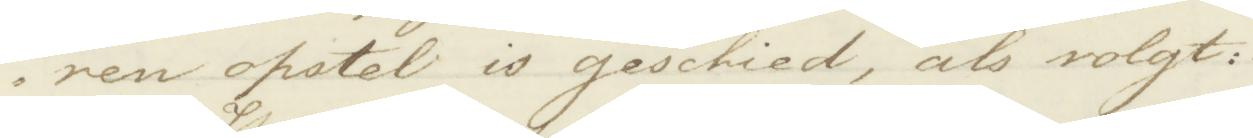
„ven opstel is geschied, als volgt:
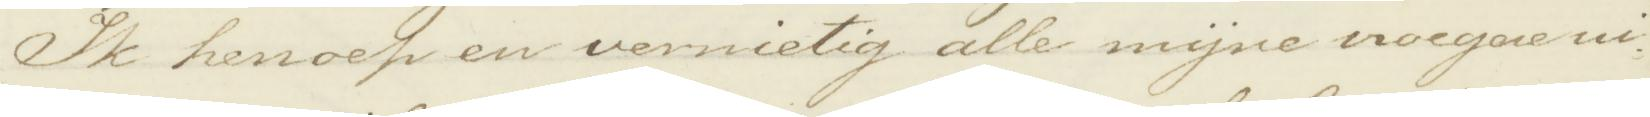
Ik herroep en vernietig alle mijne vroegere ui
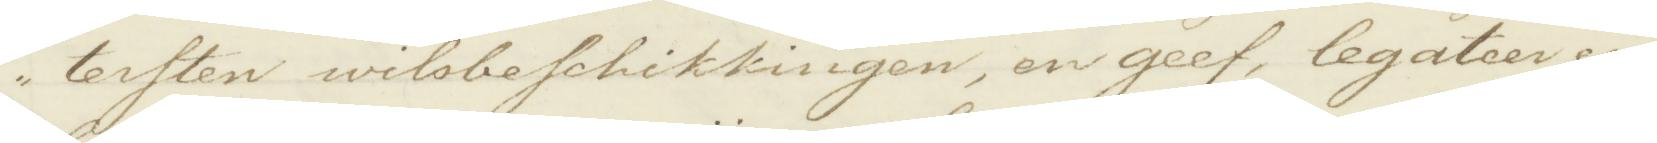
„ tersten wilsbeschikkingen, en geef, legateer en
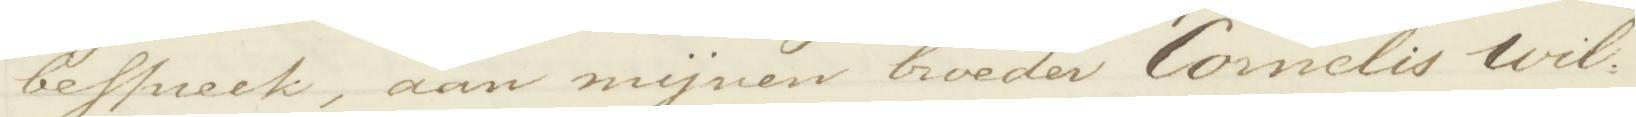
bespreek, aan mijnen broeder Cornelis Wil:
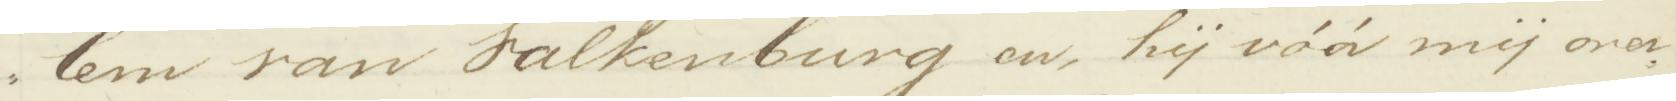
„ lem van Valkenburg en, hij vóór mij over„
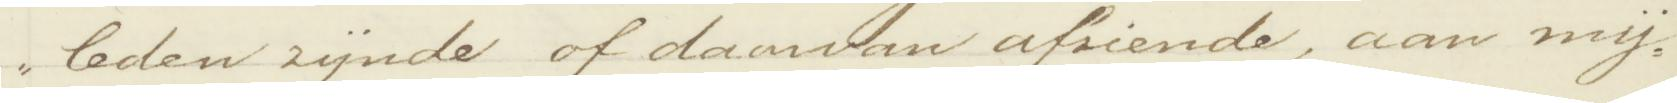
„ leden zijnde of daarvan afziende, aan mij„
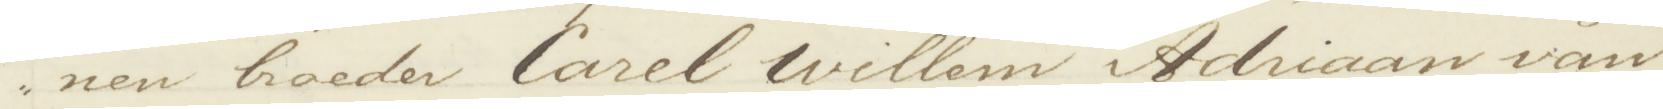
„ nen boeder Carel Willem Adriaan van
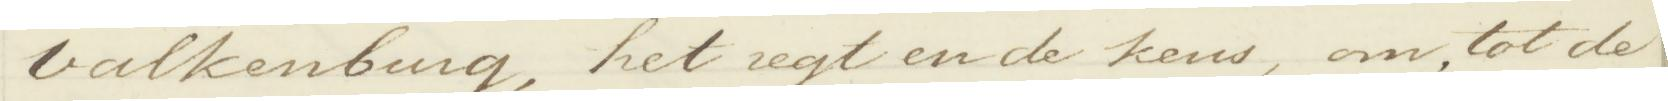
Valkenburg, het regt en de keus, om, tot de
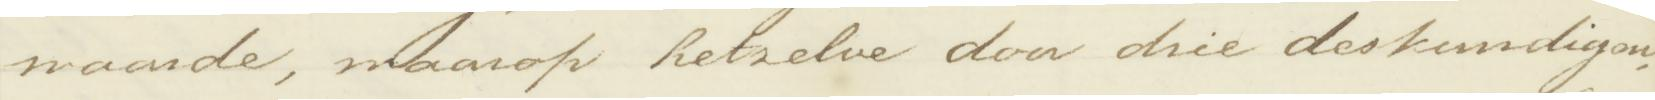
waarde, waarop hetzelve door drie deskundigen,
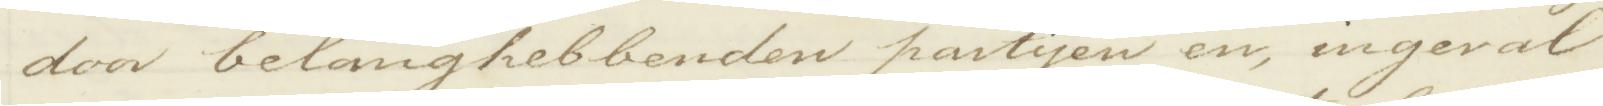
door belanghebbenden partijen en, ingeval
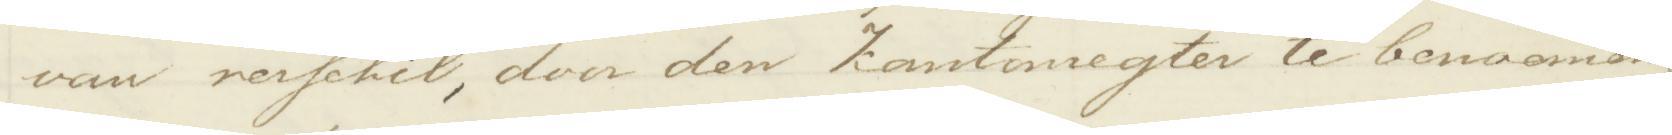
van verschil, door den kantonregter te benoemen,
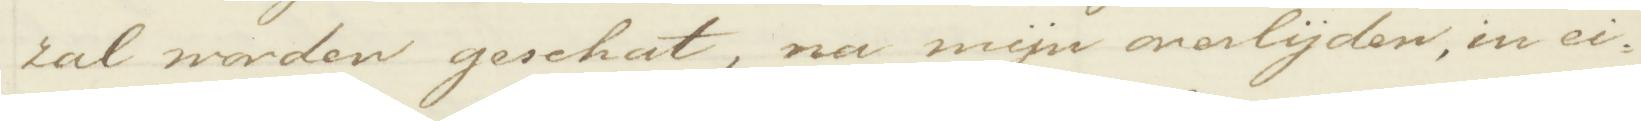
zal worden geschat, na mijn overlijden, in ei„
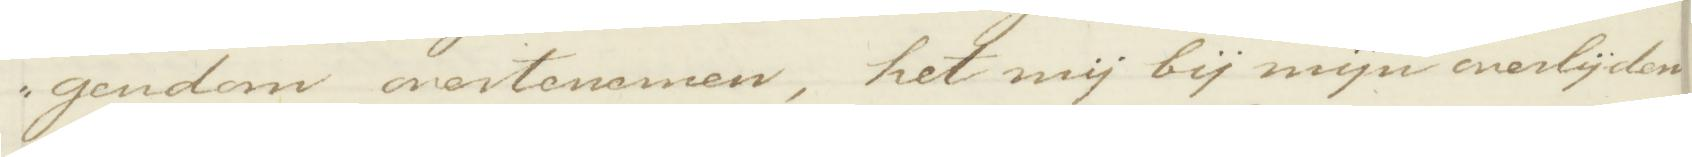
„gendom overtenemen, het mij bij mijn overlijden
